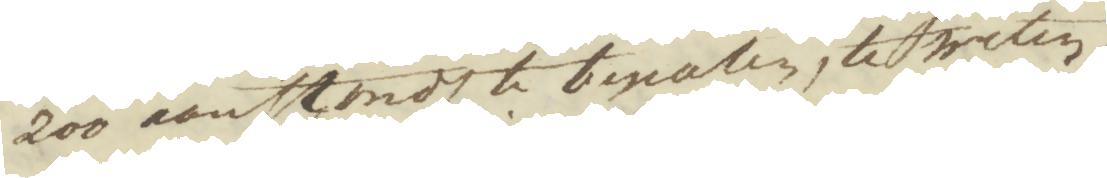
zoo aanstonds te bepalen, te weten
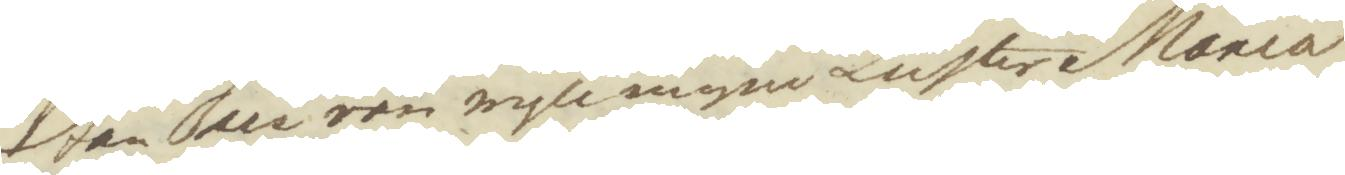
Aan die van wyle myne Zuster Maria
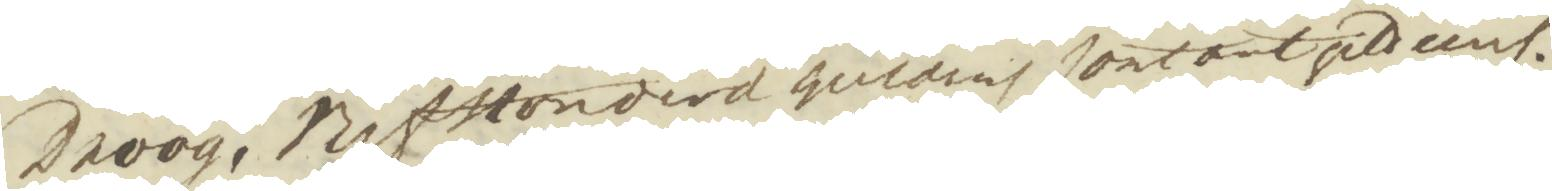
Droog, Vyfhonderd guldens Contant geld eens.
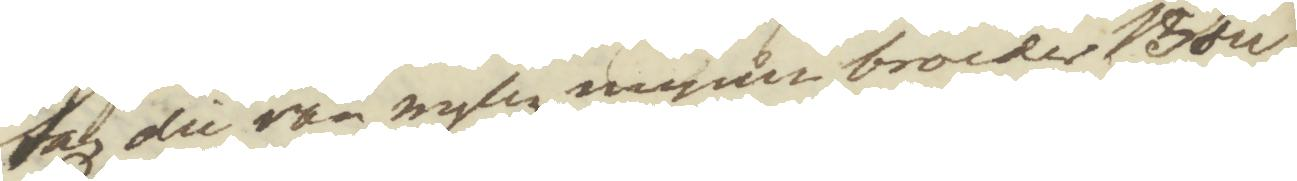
Aan die van wylen myner broeder Bou
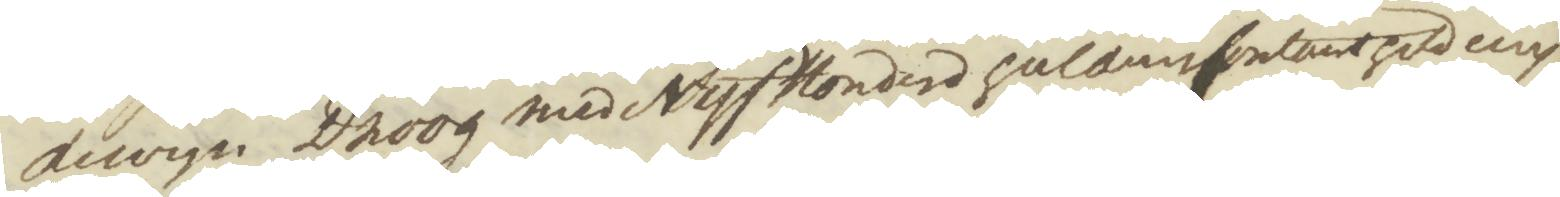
dewyn Droog mede vyf honderd guldens Contant geld eens.
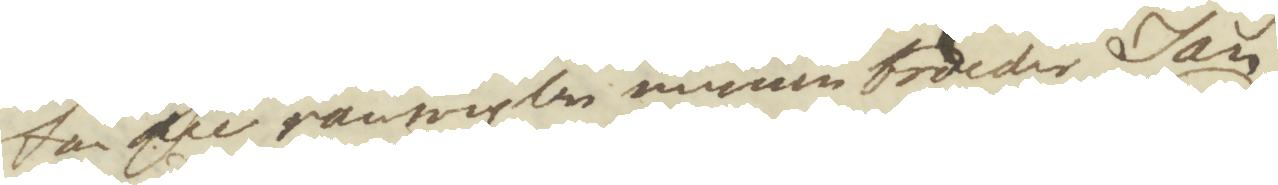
Aan die van wylen myner broeder Jan
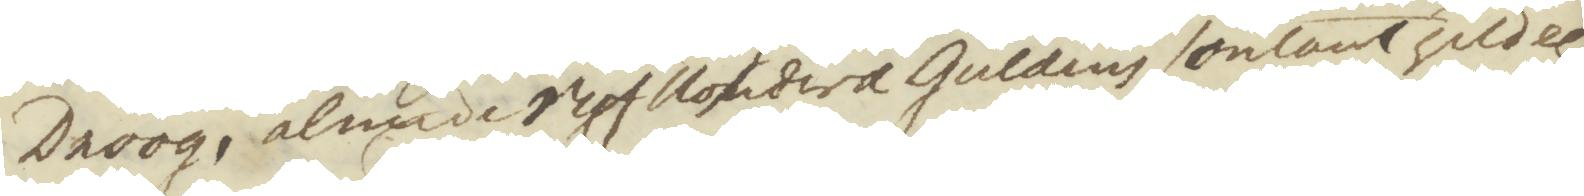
Droog, almede vyf honderd Guldens contant geld eens.
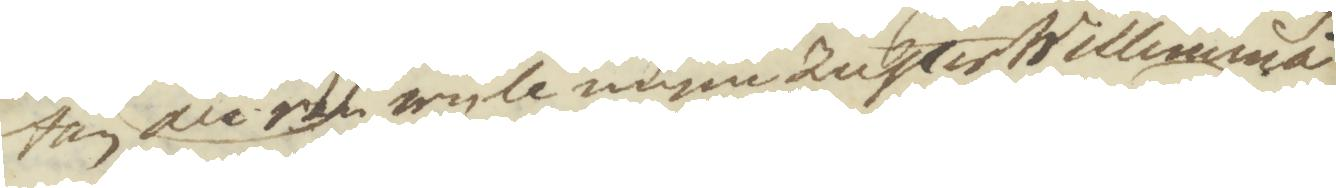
Aan die van wyle myne Zuster Willemina
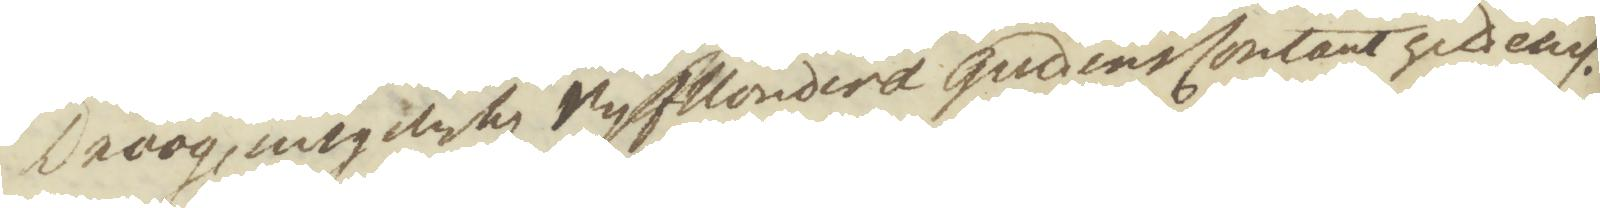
Droog, insgelyks vyfhonderd Guldens Contant geld eens
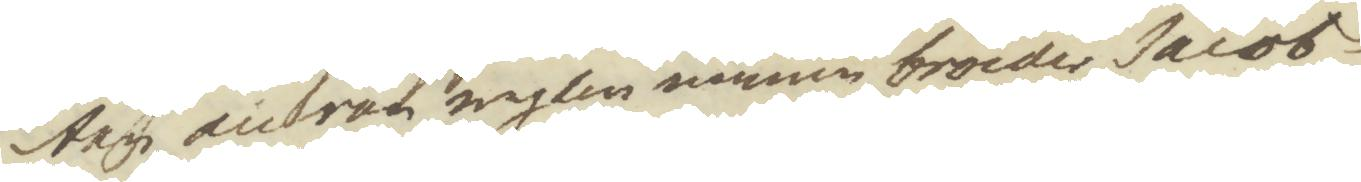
Aan die van wylen mynen broeder Jacob
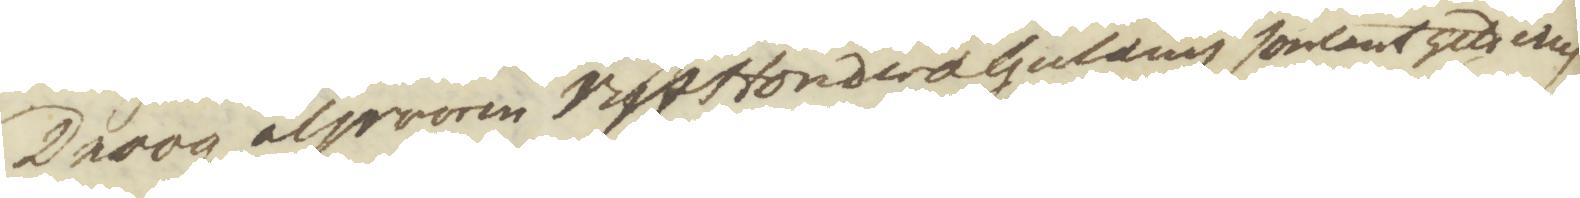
Droog alsvooren vijf Honderd Guldens contant geld eens
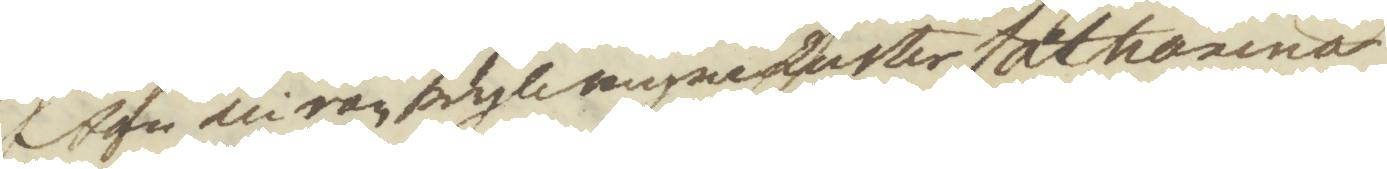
Aan die van wyle myne zuster catharina
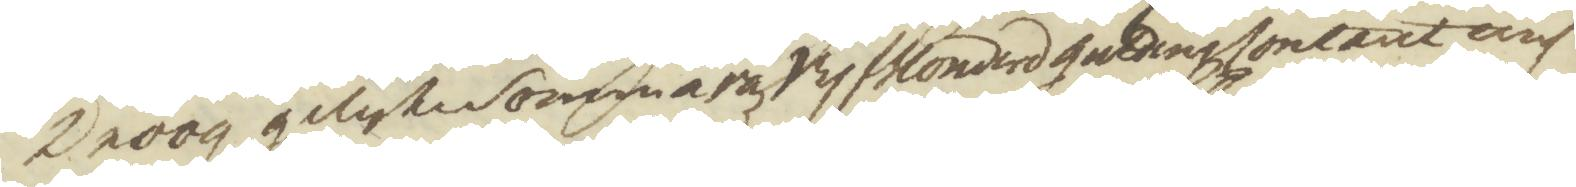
Droog gelyke Somma van vyf honderd guldens Contant eens
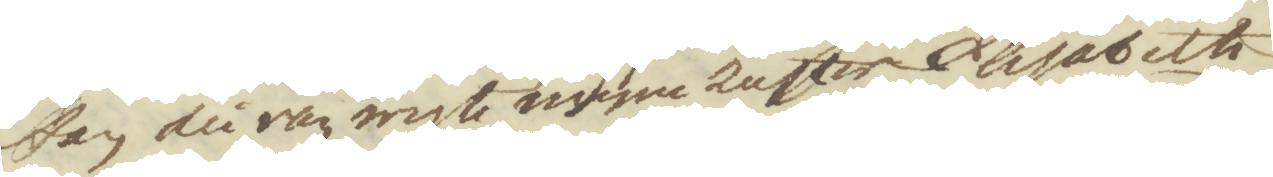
Aan die van wyle myne zuster Elisabeth
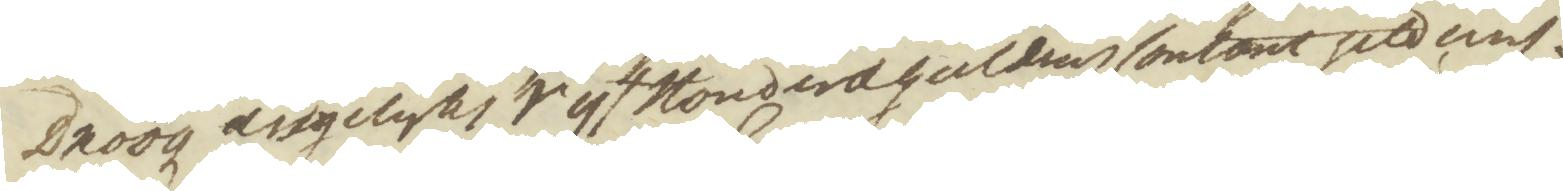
Droog dergelyks vyf Honderd guldens Contant geld eens.
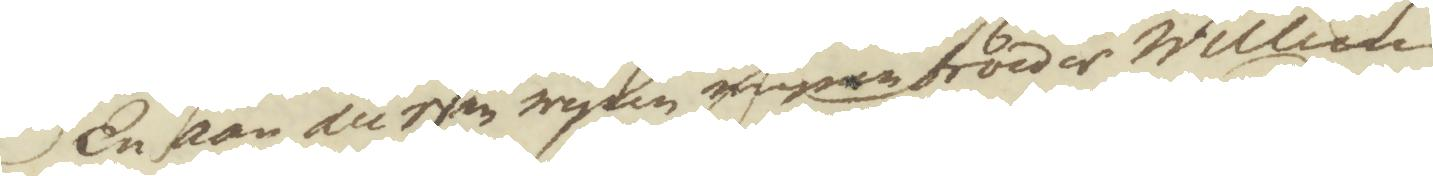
En aan die van wylen mynen broeder Willem
